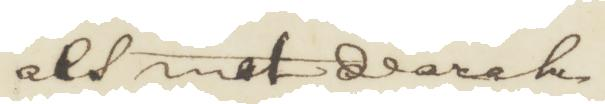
als met de arak
